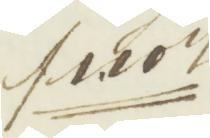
ƒ120½
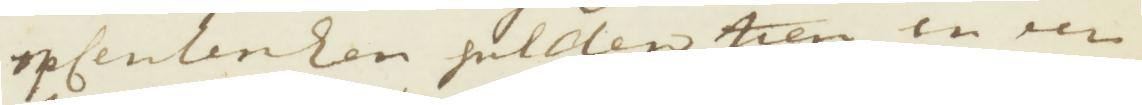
opCenten Een gulden tien en een
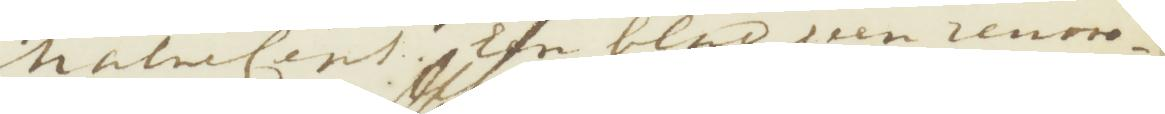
halve Cent, Een blad geen renvoo
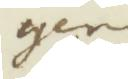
yen
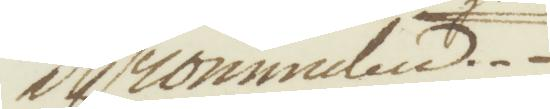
DFCromelin.
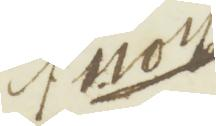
ƒ110½
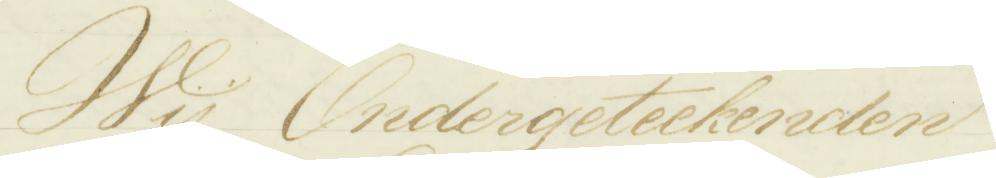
Wij Ondergeteekenden
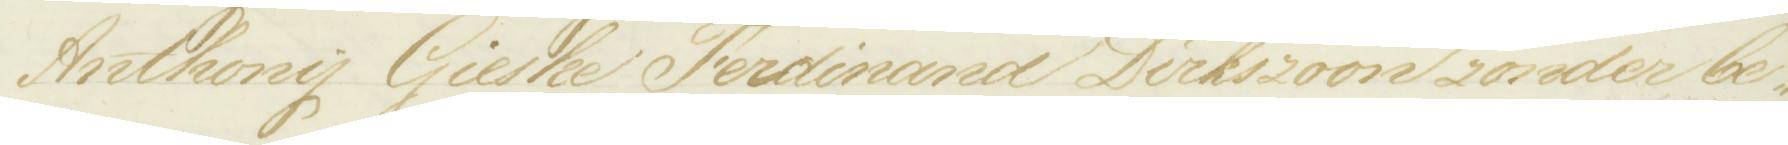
Anthonij Giessee Ferdinand Dirkszoon zonder be„
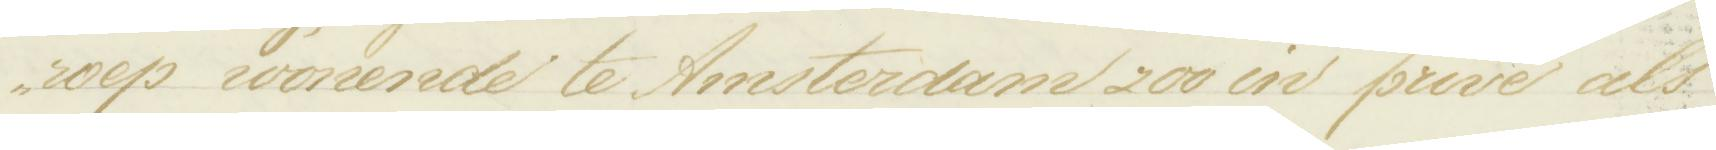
„roep wonende te Amsterdam zoo in privé als
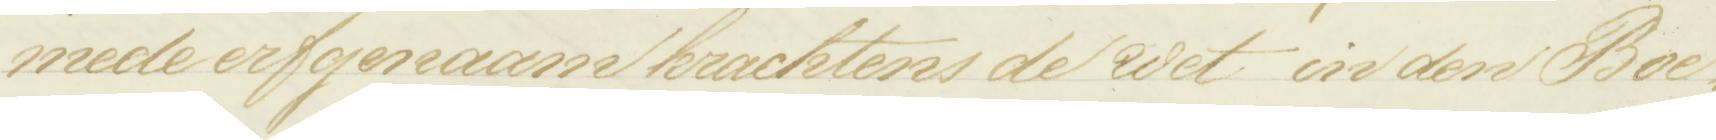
mede erfgenaam krachtens de wet in den Boe„
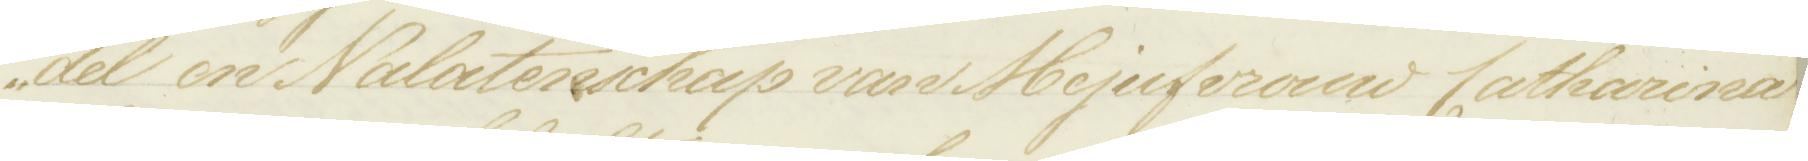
„del en Nalatenschap van Mejufvrouw Catharina
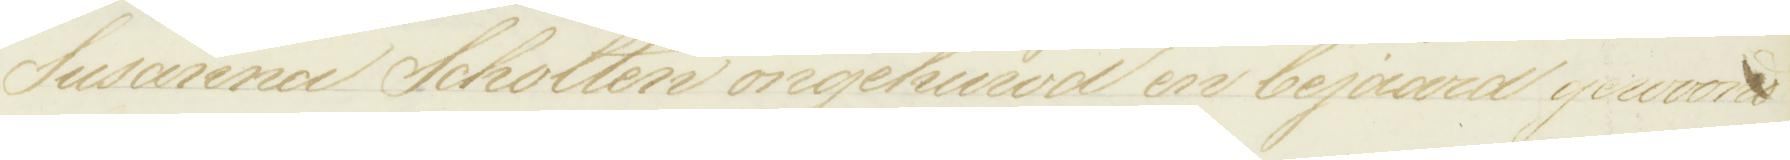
Susarina Scholten ongehuwd en bejaard gewoond
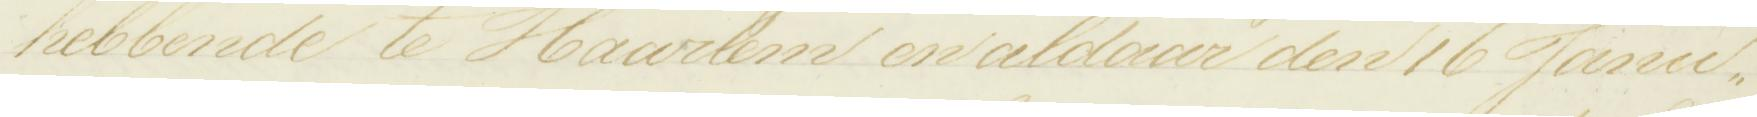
hebbende te Haarlem en aldaar den 16 Janu„
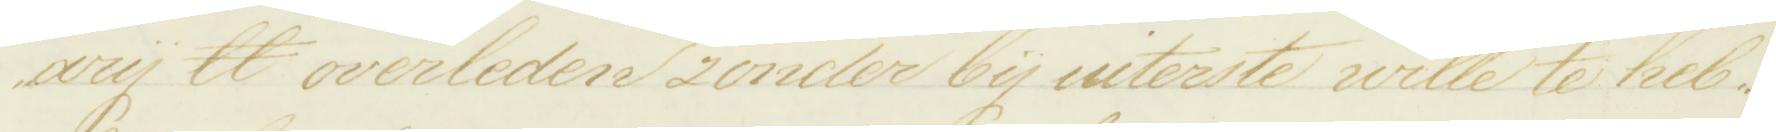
„arij Il overleden zonder bij uiterste wille te heb„
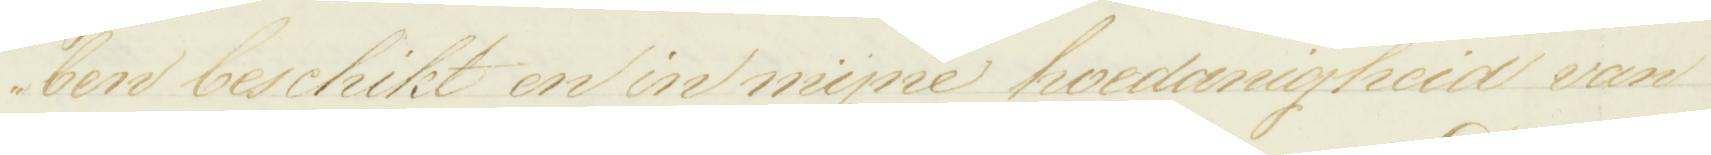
„ben beschikt en in mijne hoedanigheid van
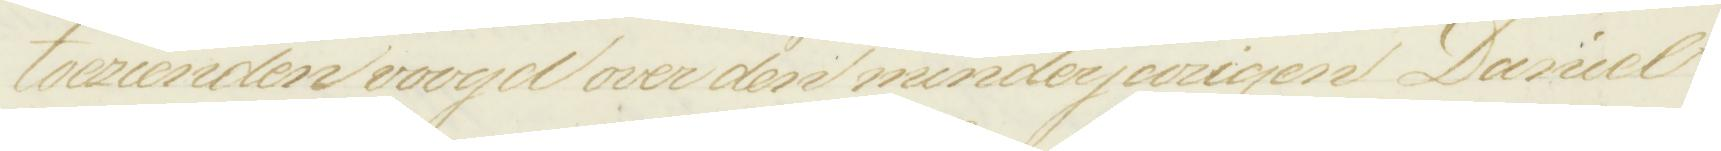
toezienden voogd over den minderjarigen Daniel
